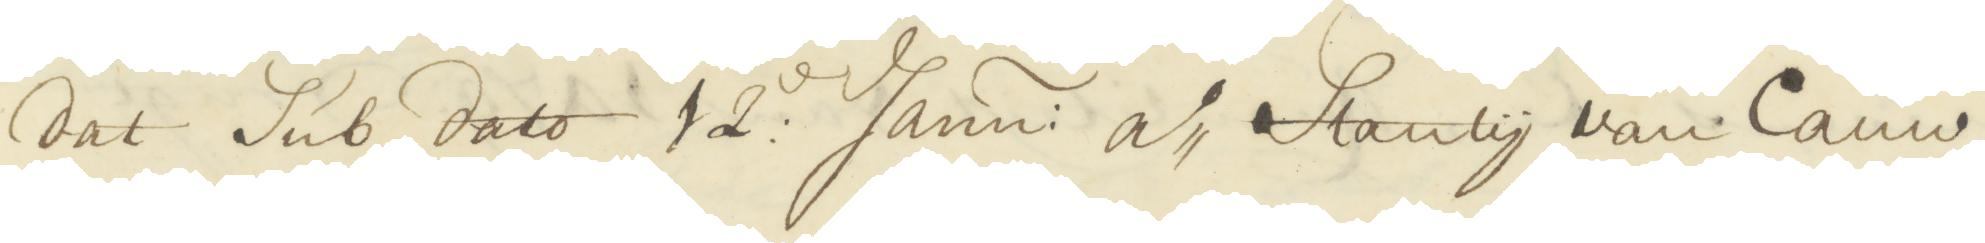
dat sub dato 12:e Janu: a„o Stantij van Cauw
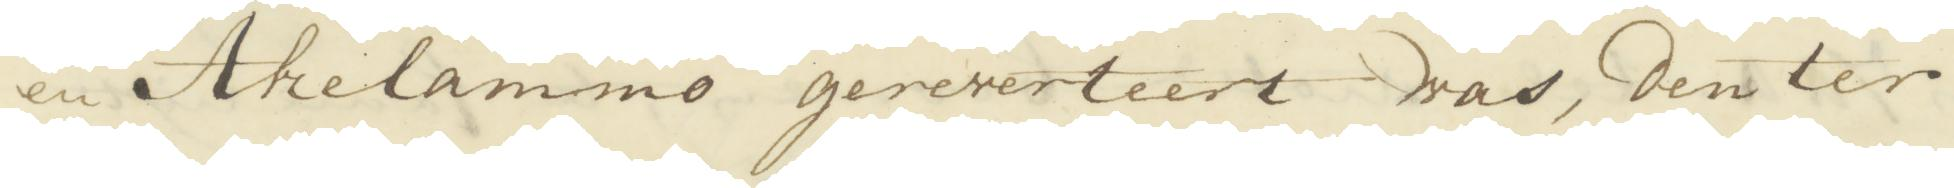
en Akelammo gereverteert was, den ter
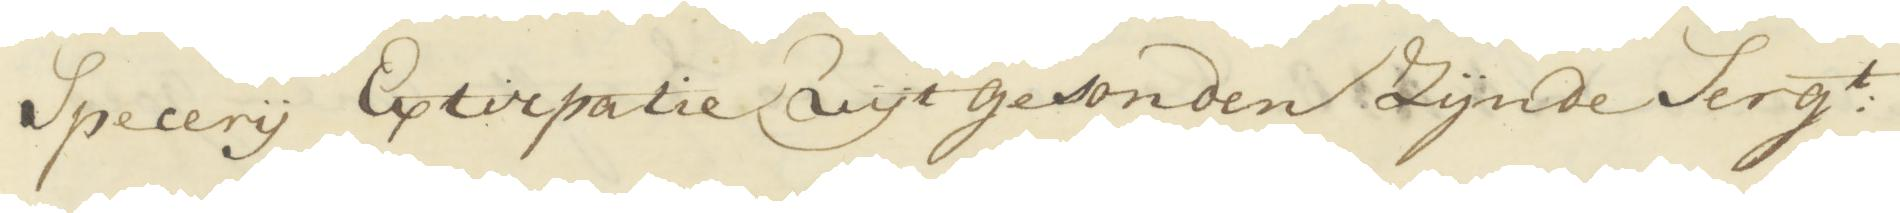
specerij Extirpatie uijt gesonden zijnde serg:t
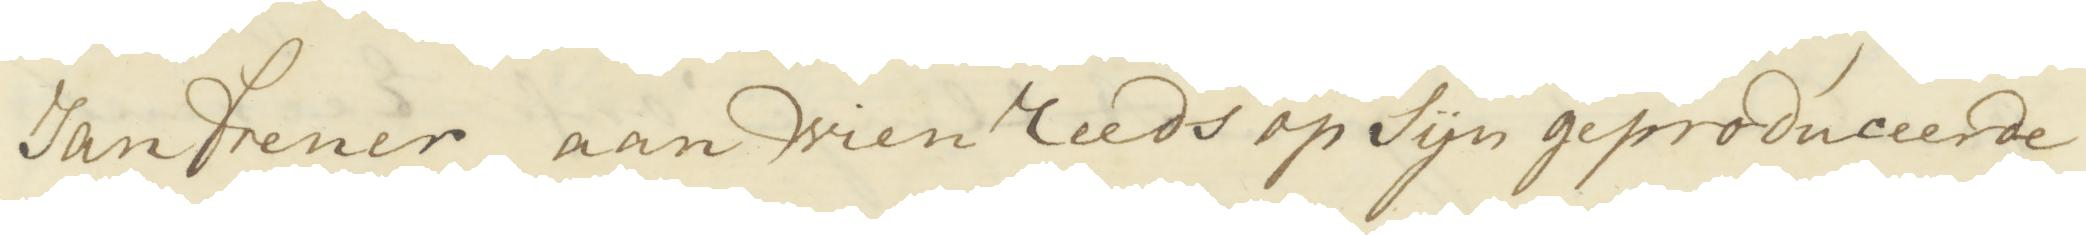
Ian frener, aan wien reeds op sijn geproduceerde
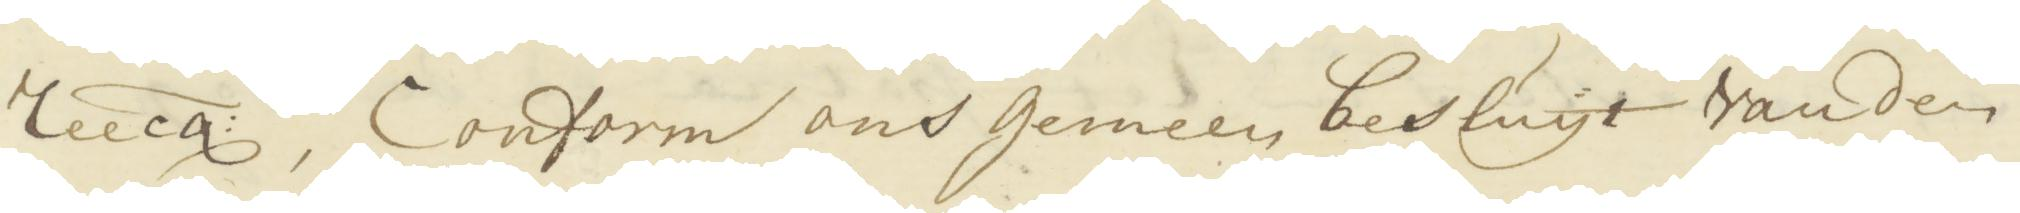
reecq:, Conform ons gemeen besluijt van den
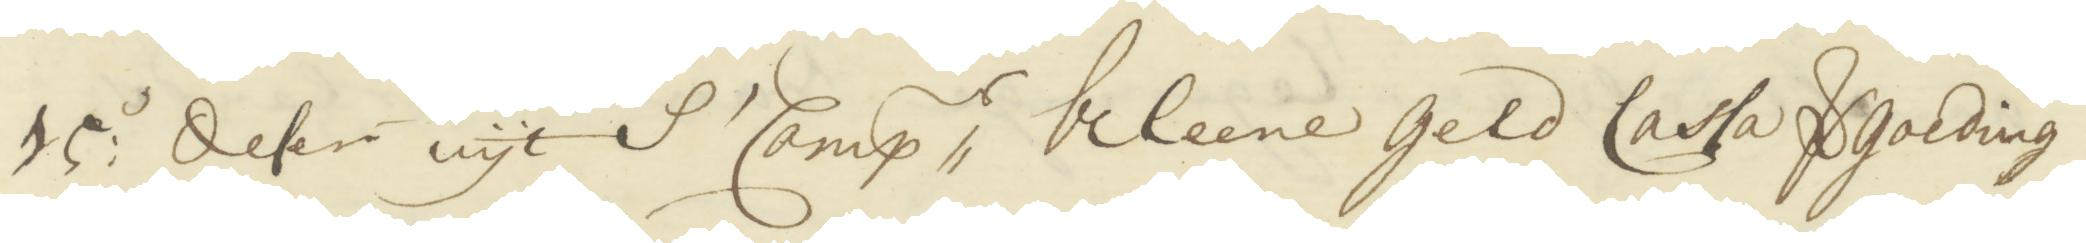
15:e deser uijt s'Comp„s kleene geld Cassa vergoeding
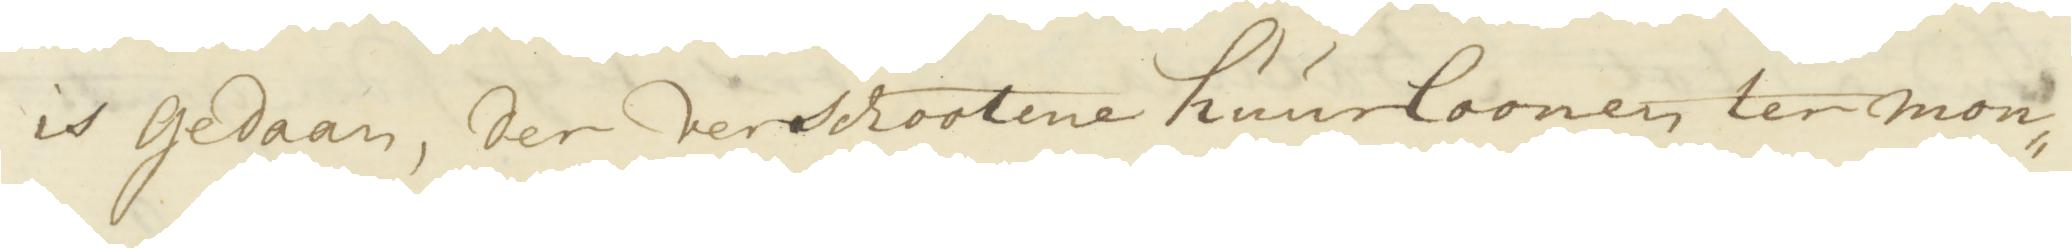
is gedaan, der verschootene huurloonen ter mon„
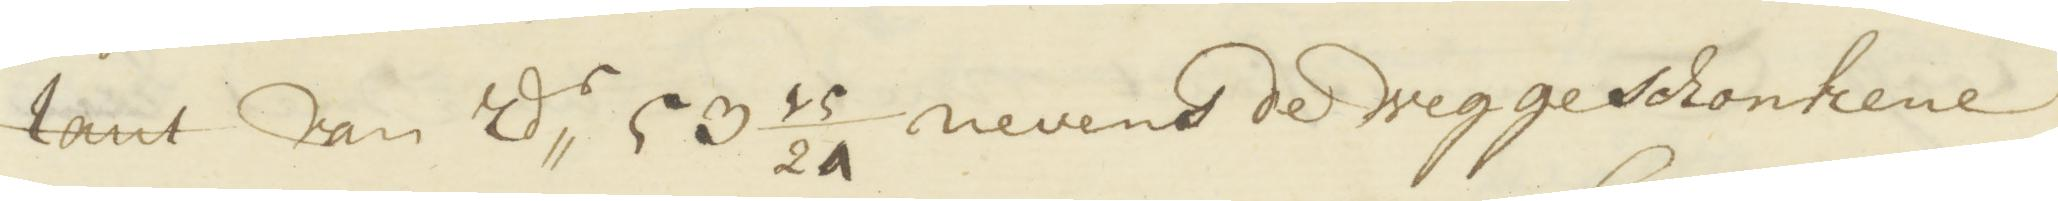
tant van rd„s 53 15/24 nevens de weggeschonkene
